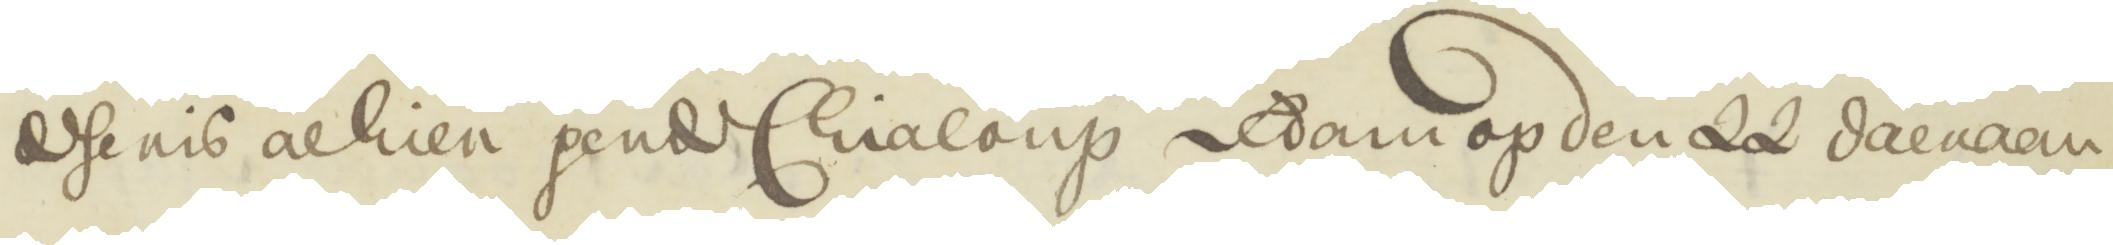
deser is alhier perde Chialoup Edam op den 22 daeraan
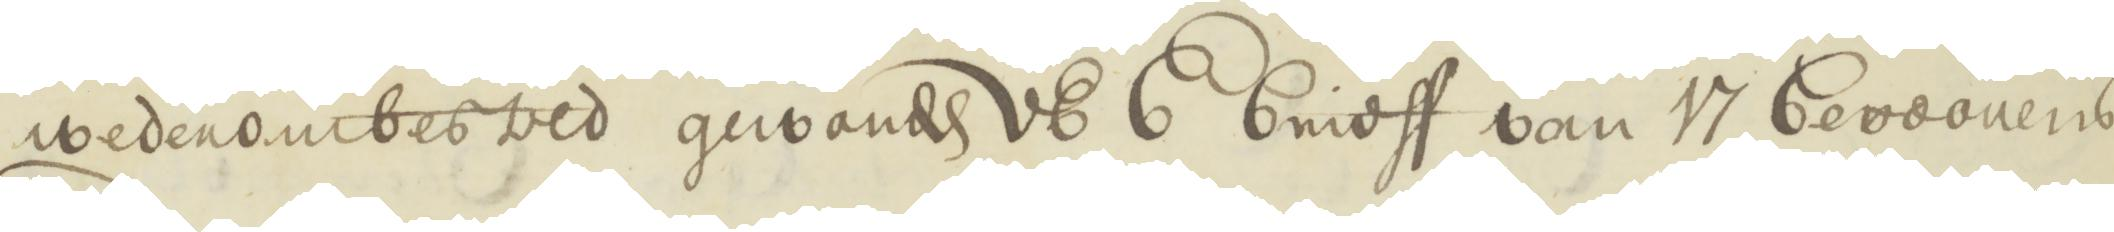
wederom besteld gevonden VE E brieff van 17 bevoorens
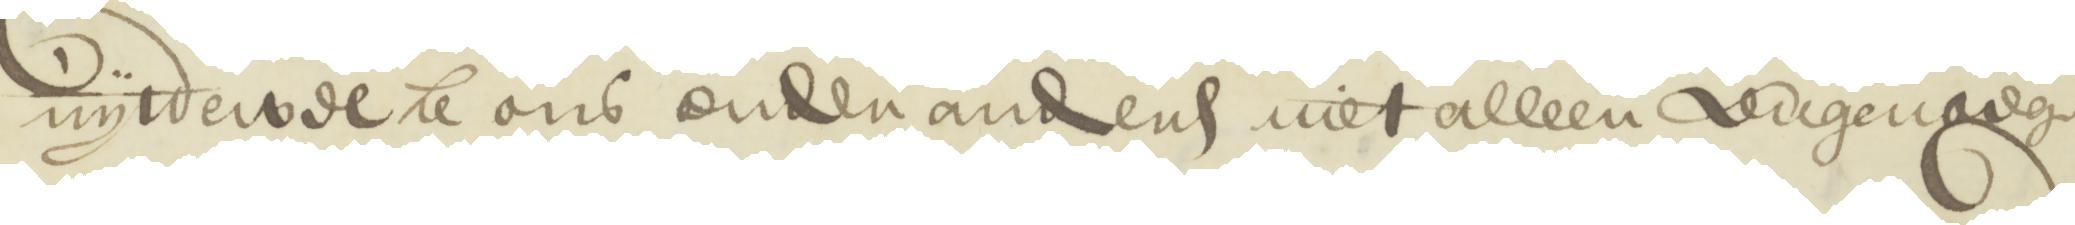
uijt dewelke ons onder anderen niet alleen ten genoege
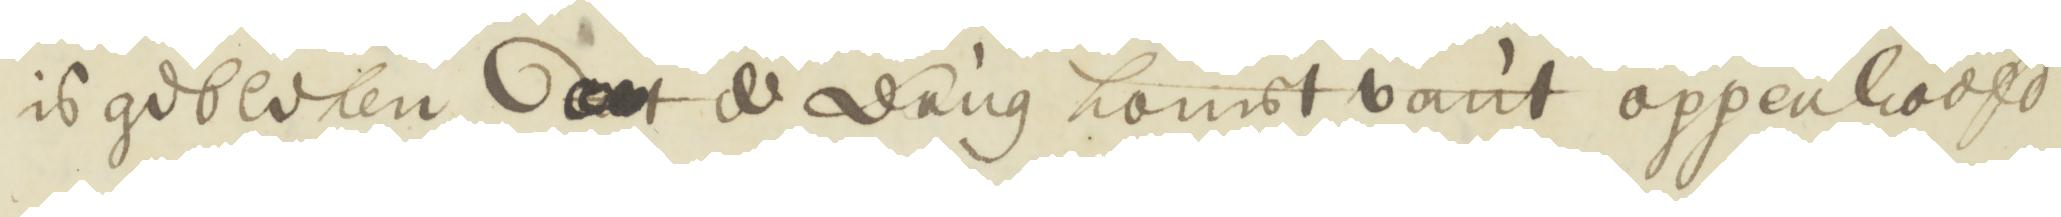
is gebleken dat de terug komst van’t opperhoofd
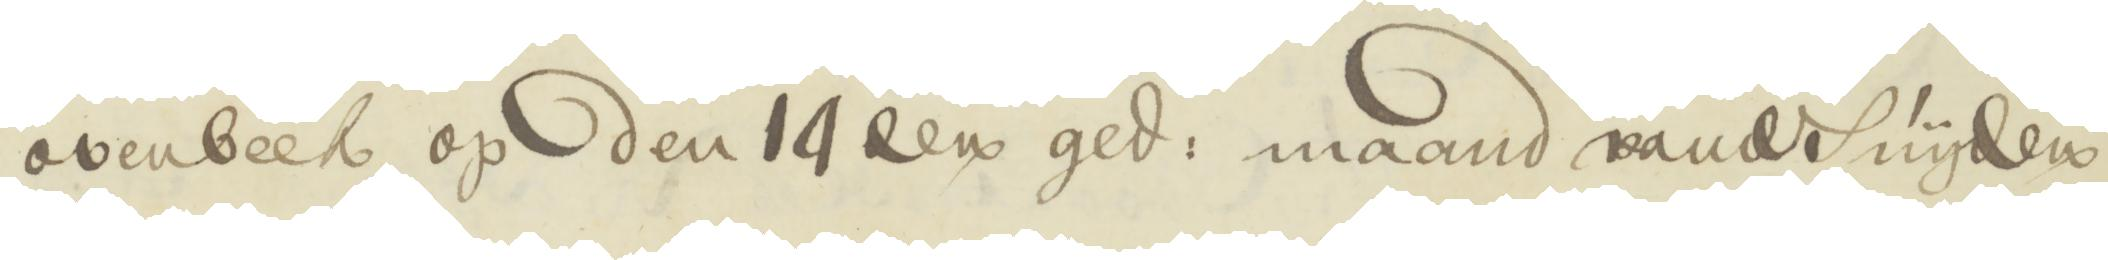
overbeek op den 14 der ged: maand van de Suijder
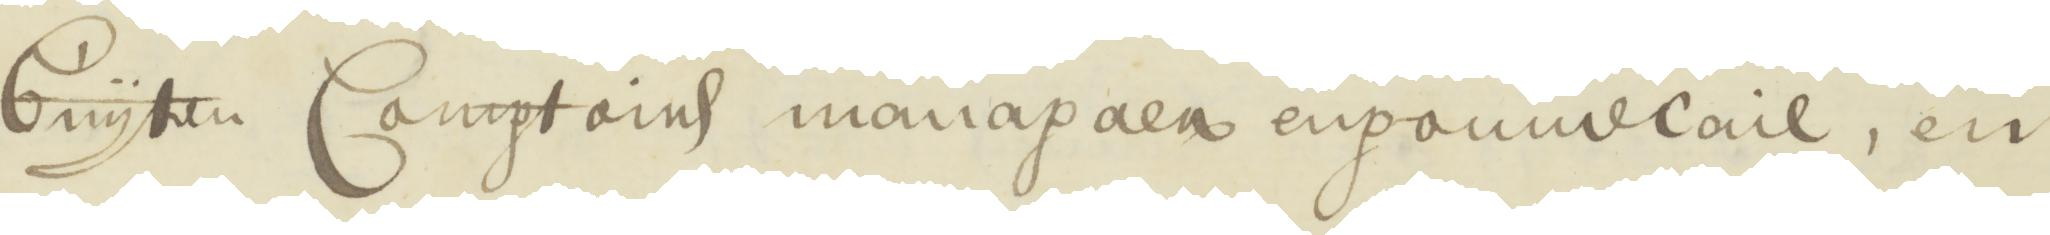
buijten Comptoiren manapaer en ponnecail, en
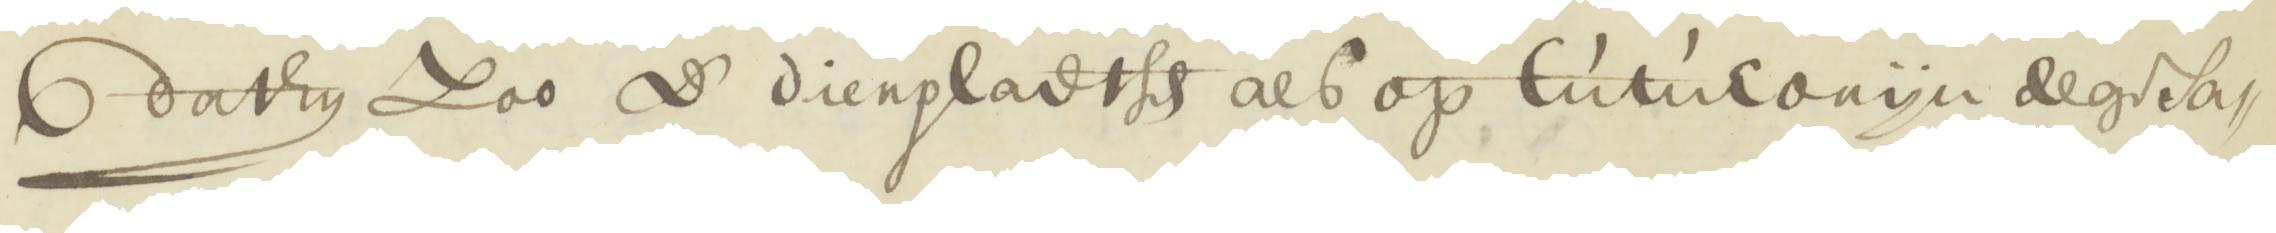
dat hy Zoo te dierplaetsen als op Tutucorijn de gesa„
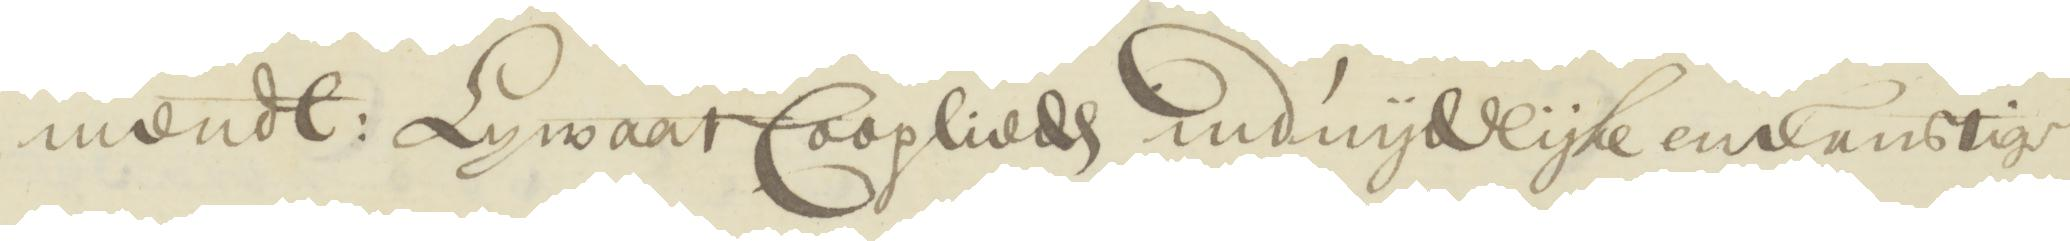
mendlijke Lywaat Cooplieden induijdelijke en Ernstige
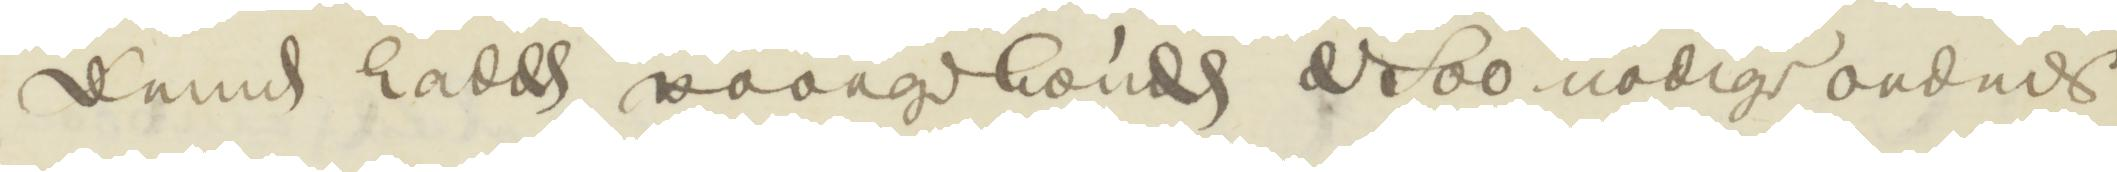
termen hadden voorgehouden de Soo nodige ordres
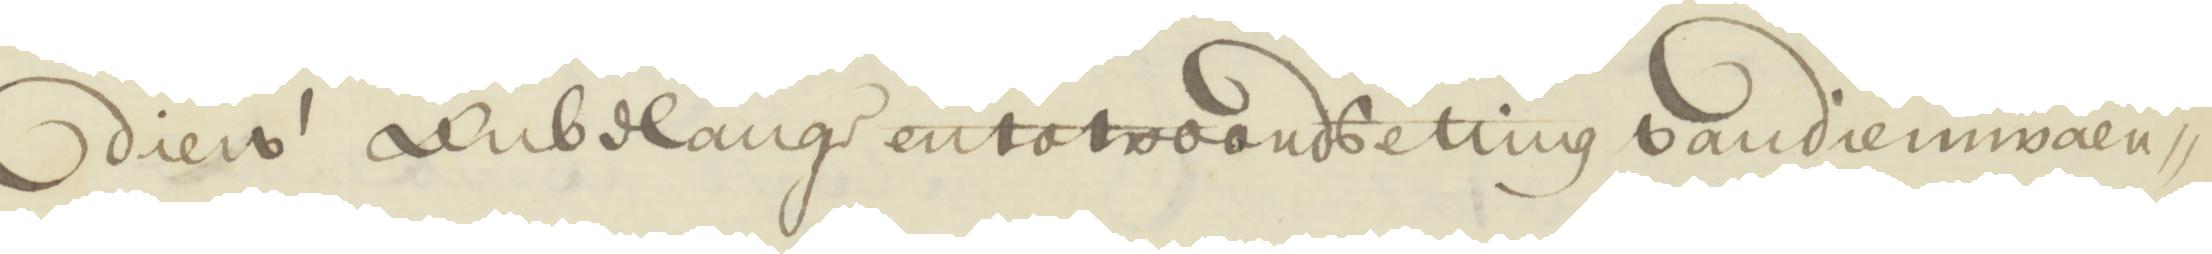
die w' tenbelange en tot voordseting van dienn waer„
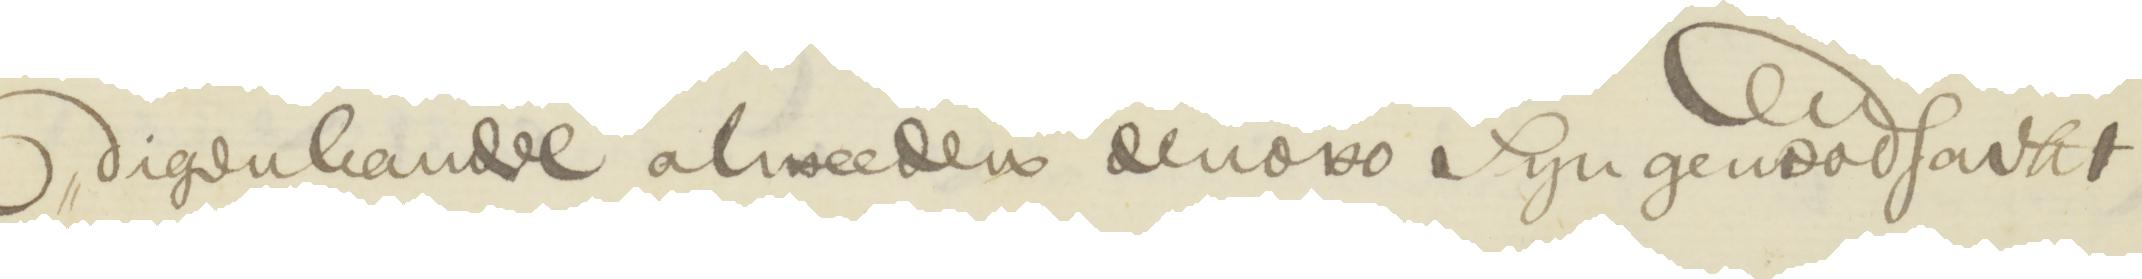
„digen handel alweeder de novo Syn genoodsaekt
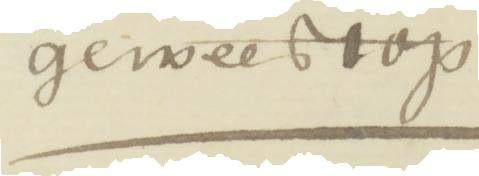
geweest op
